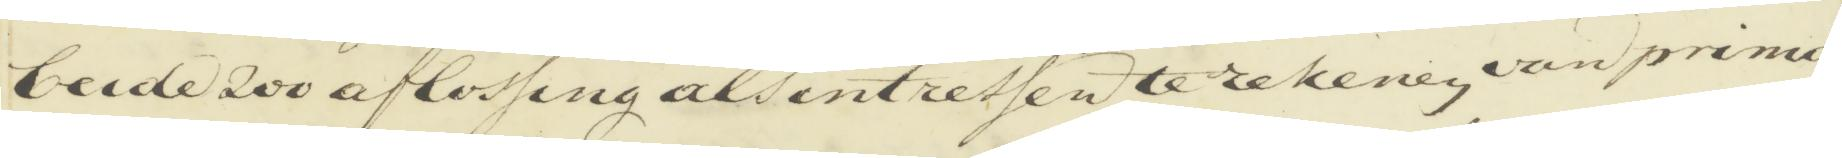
beide zoo aflossing als intressen te rekenen van primo
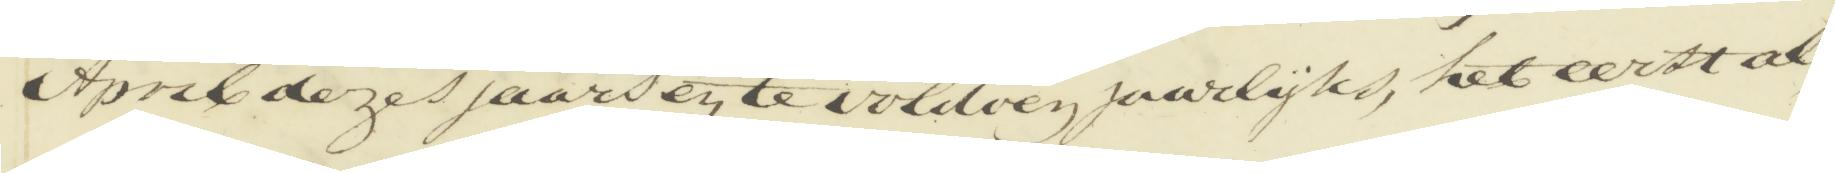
April dezes jaars en te voldoen jaarlijks, het eerst al„
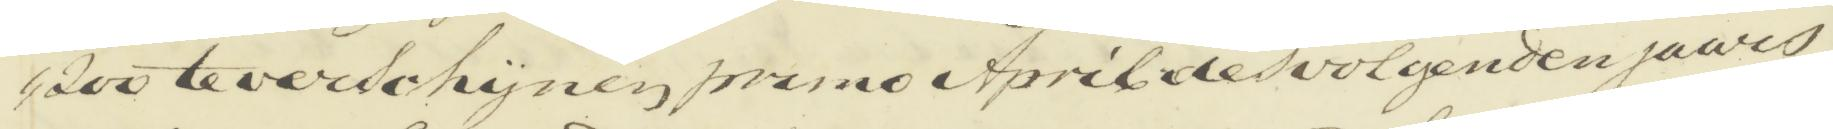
„zoo te verschijnen primo April des volgenden jaars
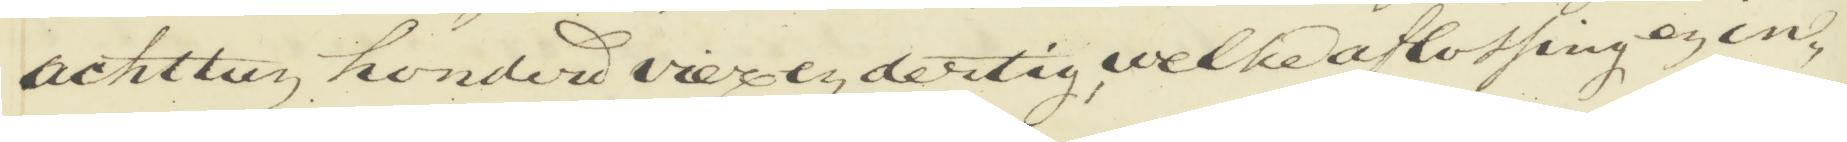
achttien honderd vier en dertig, welke aflossing en in„
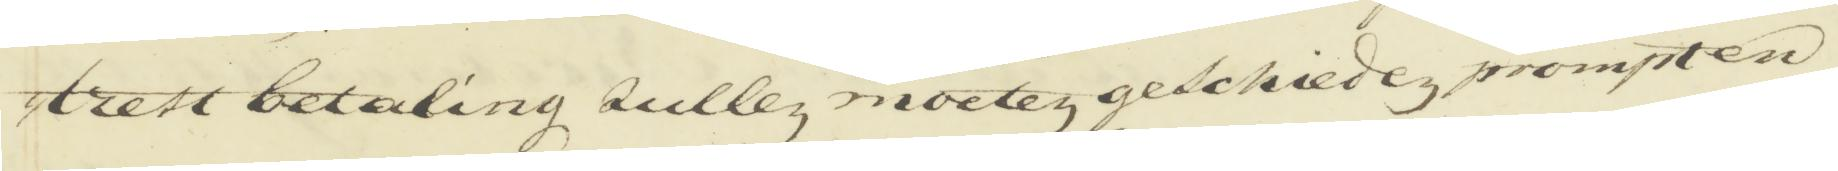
„trest betaling zullen moeten geschieden prompt en
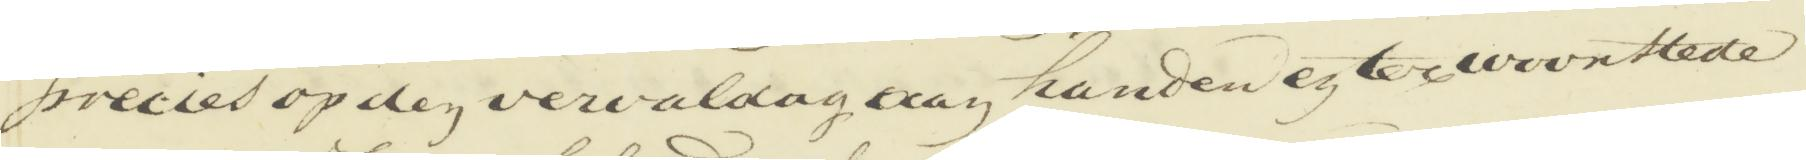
precies op den vervaldag aan handen en ter woonstede
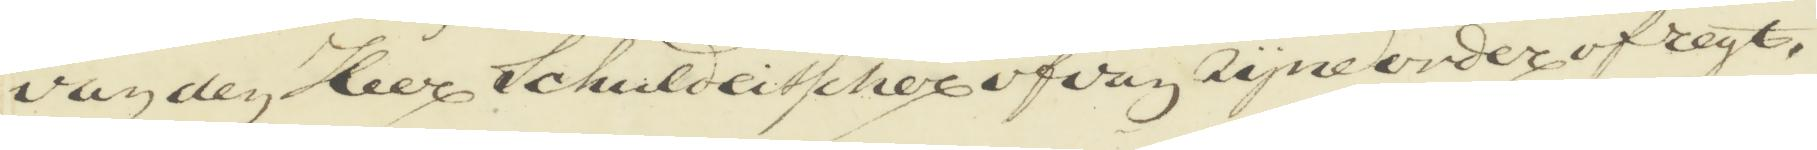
van den Heer schuldeisscher of van zijne order of regt,
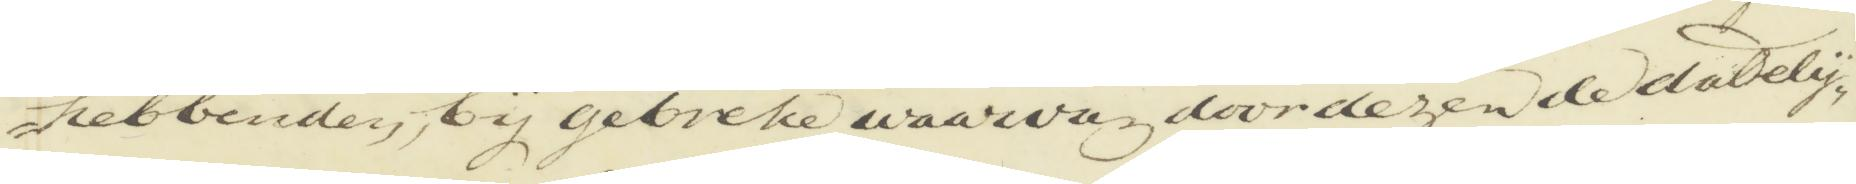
=hebbenden, bij gebreke waarvan door dezen de dadelij„
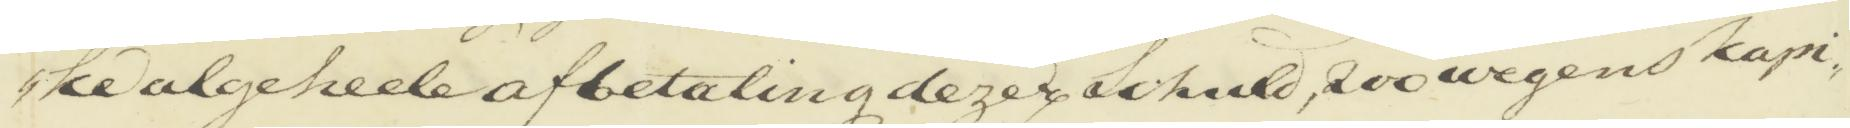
„ke algeheele afbetaling dezer schuld, zoo wegens kapi„
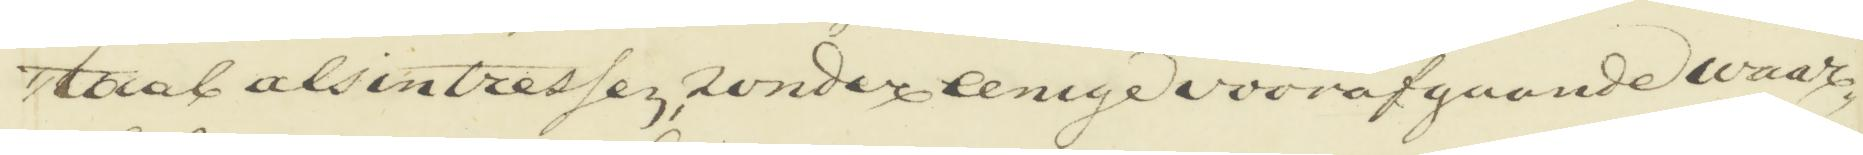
„taal als intressen, zonder eenige voorafgaande waar„
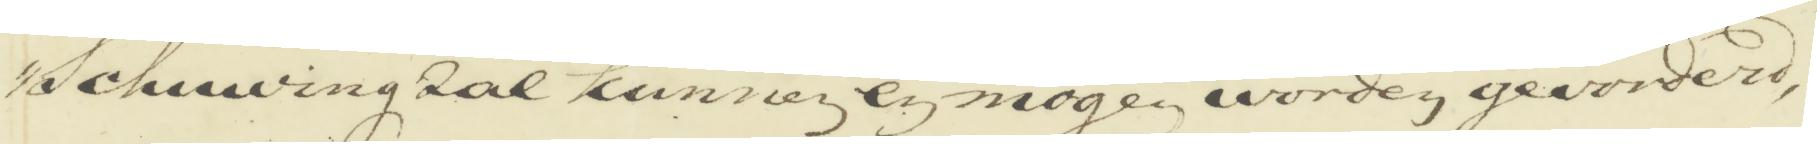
„schuwing zal kunnen en mogen worden gevorderd,
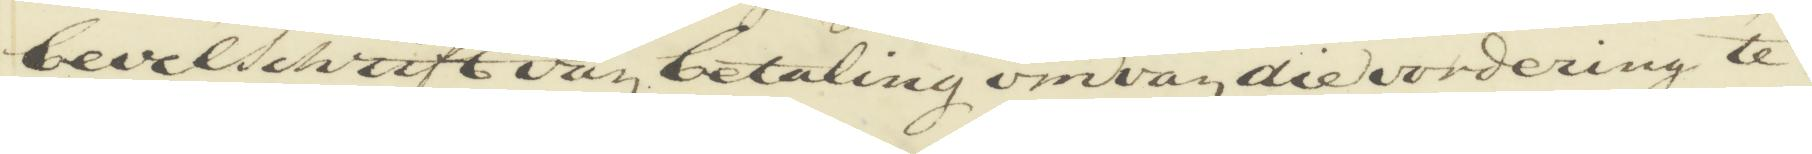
bevelschrift van betaling om van die vordering te
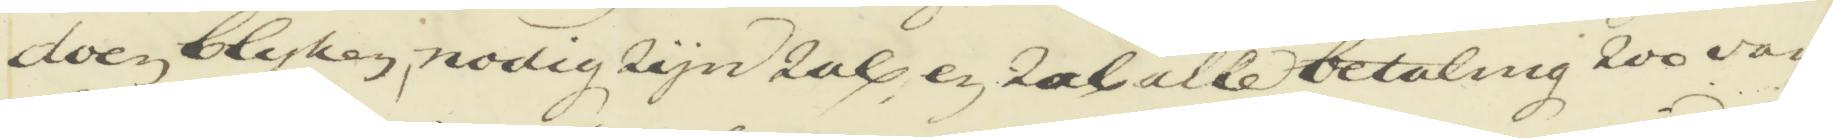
doen blyken, nodig zijn zal, en zal alle betaling zoo van
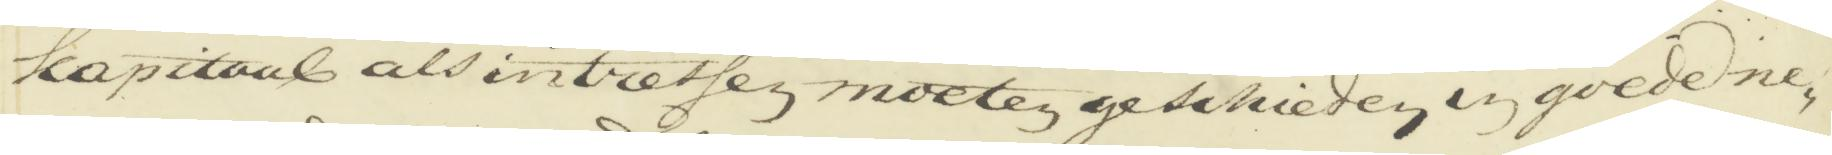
kapitaal als intressen moeten geschieden in goede ne„
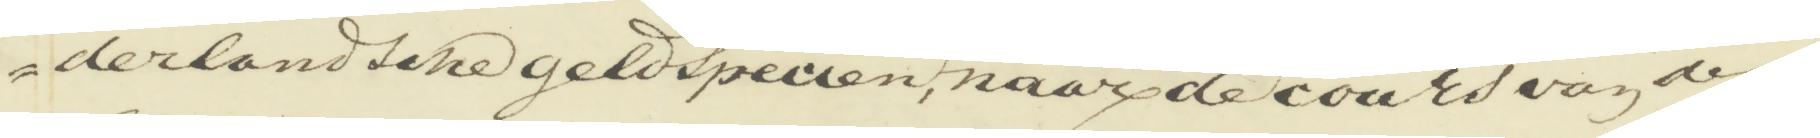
„derlandsche geldspecien, naar de cours van den
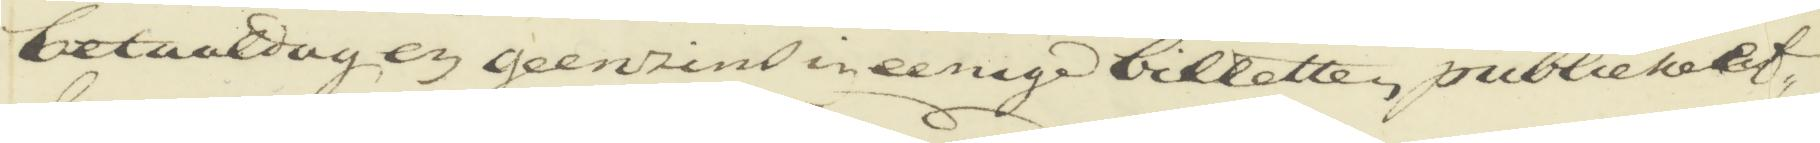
betaaldag, en geenzins in eenige billetten, publieke ef„
